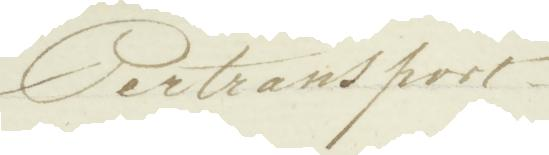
Per transport . . . . . ƒ 321 „ 40.
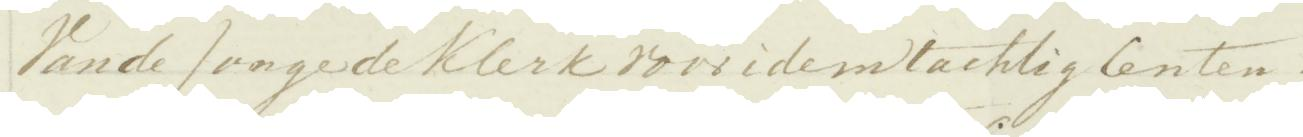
Van de Jonge de Klerk voor idem tachtig Centen . . . . . . . . . „ — „ 80
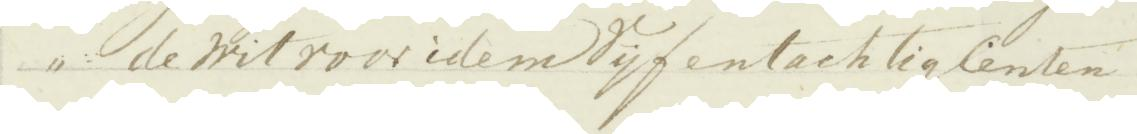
„ de wit voor idem Vijf en tachtig Centen . . . . . . . . . . . . „ — „ 85
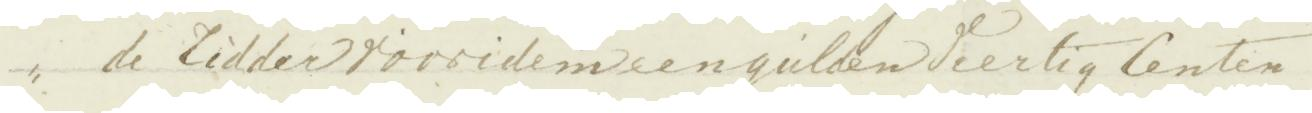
„ de ridder voor idem een gulden Veertig Centen . . . . . . . . . „ 1. 40
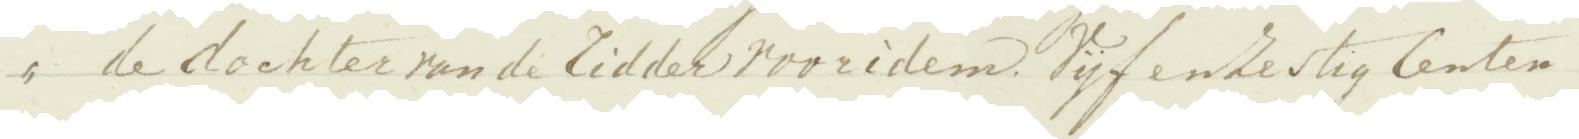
„ de dochter van de ridder voor idem Vijf en Zestig Centen . . . . . „ — „65.
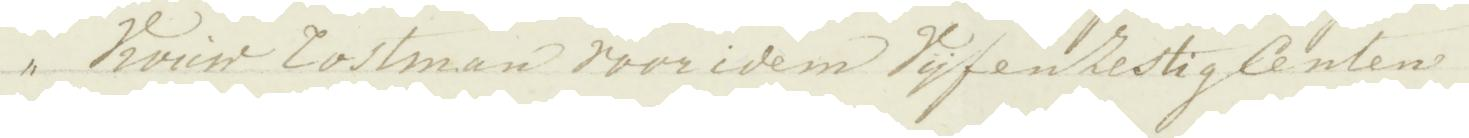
„ Vrouw rostman voor idem Vijf en Zestig Centen . . . . . . „ — .65
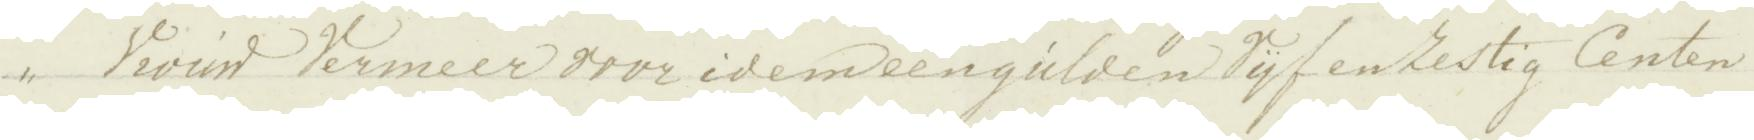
„ Vrouw Vermeer voor idem een gulden Vijf en Zestig Centen . . . „ 1 .65
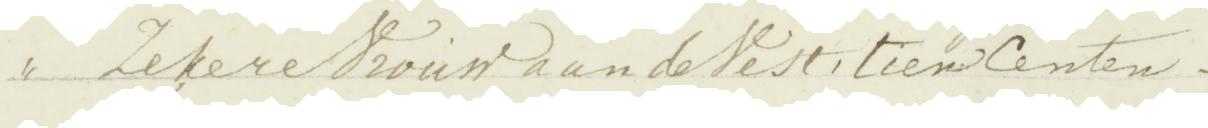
„ Zekere Vrouw aan de Vest, tien Centen . . . . . . . . . . . „ — „ 10.
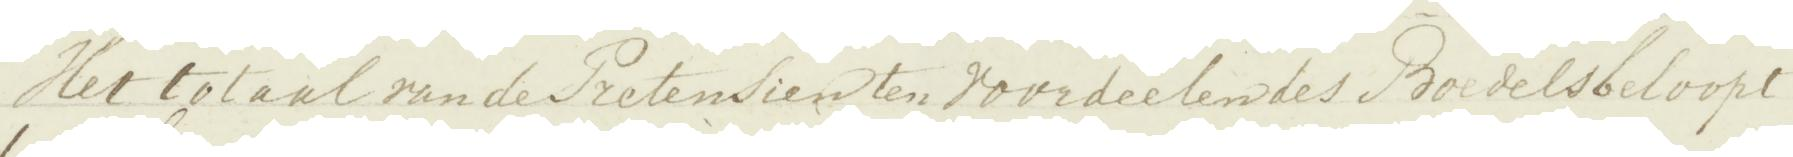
Het totaal van de Pretensien ten voordeelen des Boedels beloopt
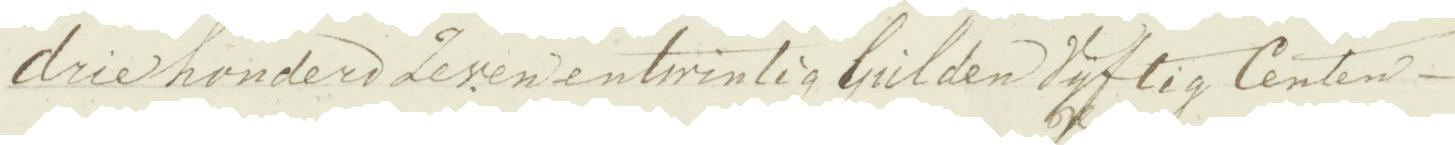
drie honderd Zeven en twintig Gulden Vijftig Centen . . . . . . ƒ 327 :50
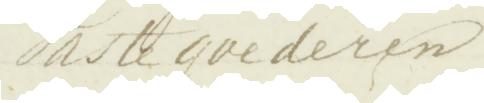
vaste goederen
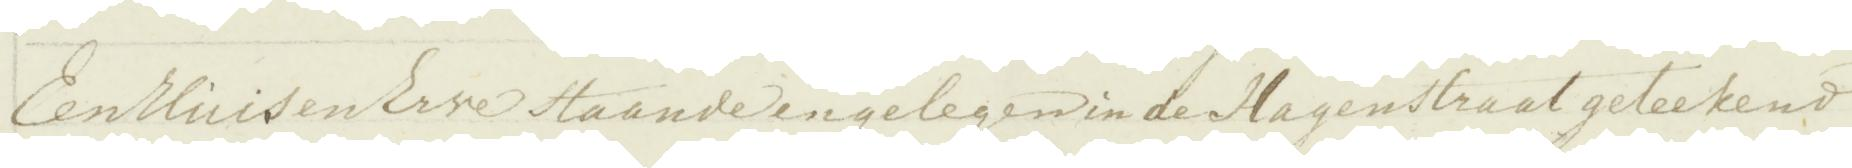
Een Huis en Erve staande en gelegen in de Hagenstraat geteekend
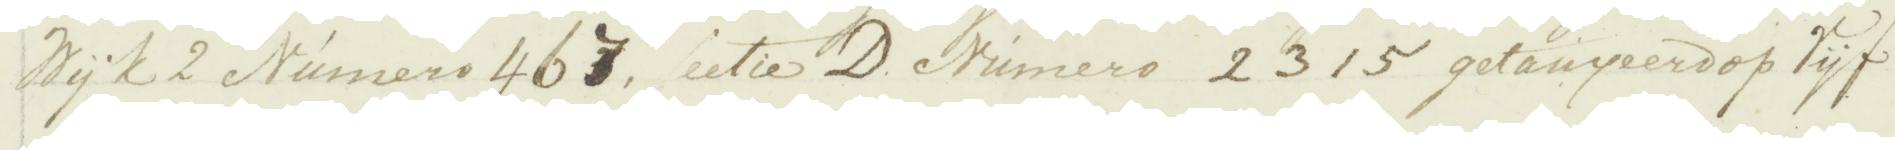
Wijk 2 Numero 467, sectie D. Numero 2315 getauxeerd op Vijf
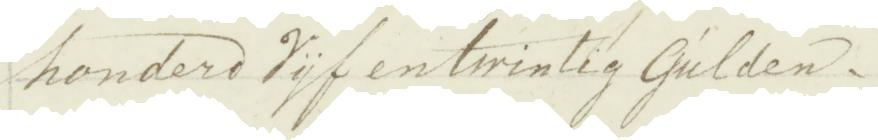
honderd Vijf en twintig Gulden . . . . . . . . . . . . . . . . . . . ƒ 525. –
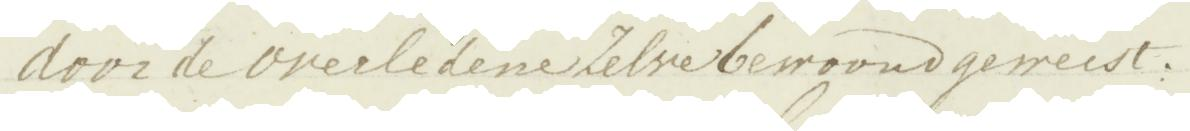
door de overledene zelve bewoond geweest:
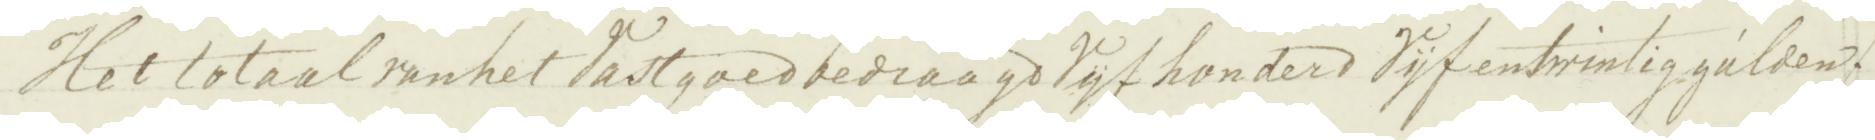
Het totaal van het Vastgoed bedraagd Vijf honderd Vijf en twintig gulden ƒ 525. —
